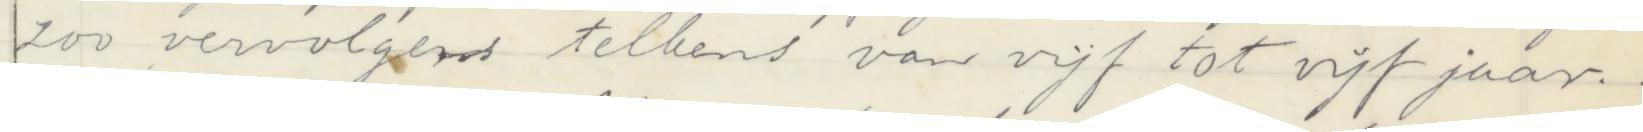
zoo vervolgens telkens van vijf tot vijf jaar.
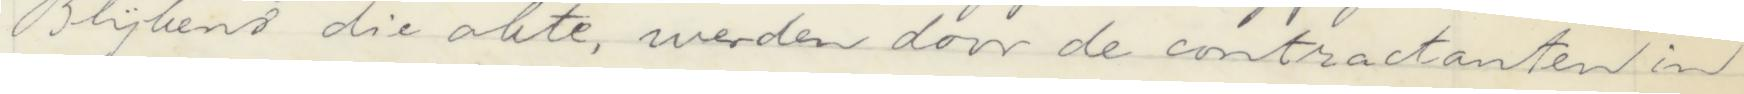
Blijkens die akte, werden door de contractanten in
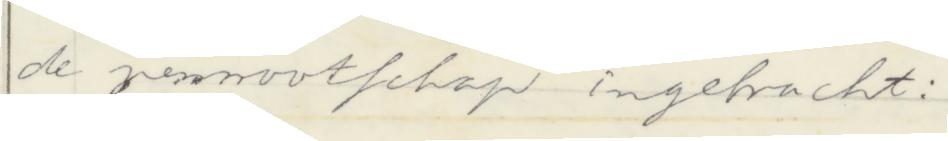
de vennootschap ingetracht:
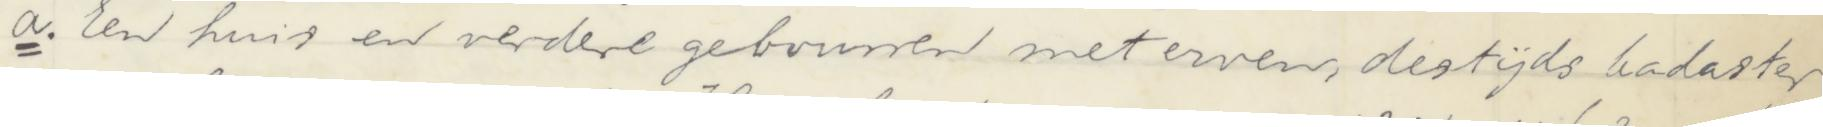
a. Een huis en verdere gebouwen met erven, destijds kadaster
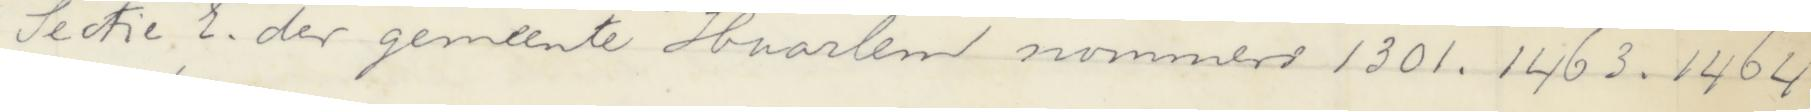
sectie E. der gemeente Haarlem nommers 1301. 1463. 1464
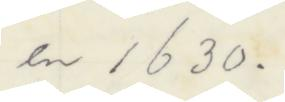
en 1630.
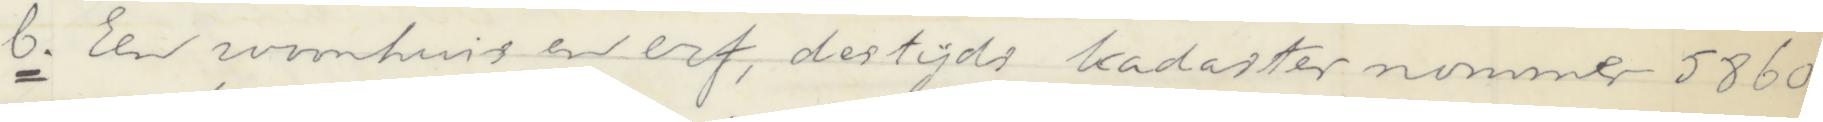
b. Een woonhuis en erf, destijds kadaster nommer 5860
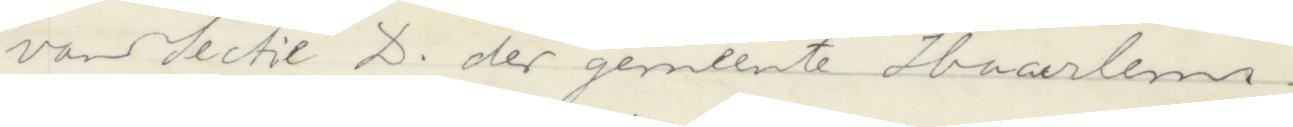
van sectie D. der gemeente Haarlem.
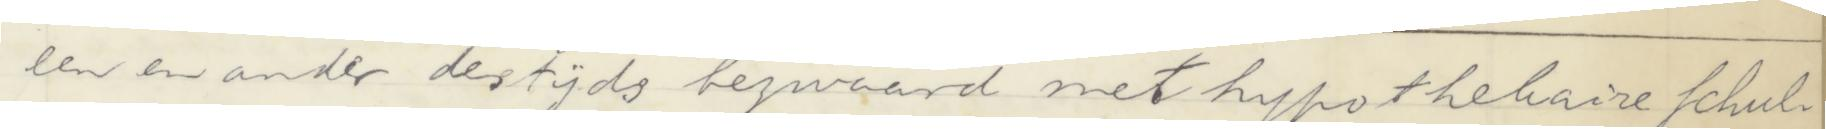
een en ander destijds bezwaard met hypothekaire schuld-
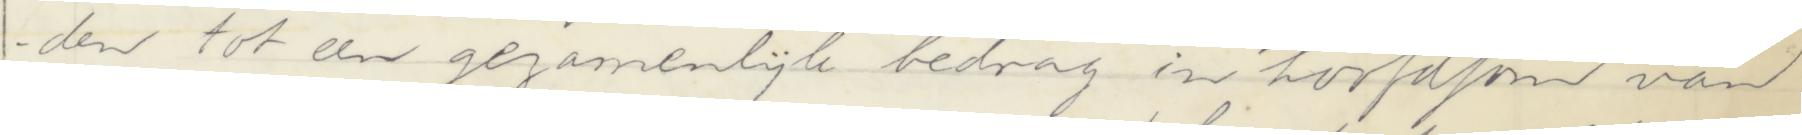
-den tot een gezamenlijk bedrag in hoofdsom van
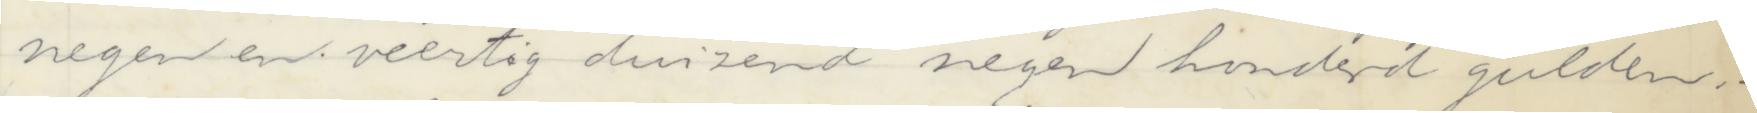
negen en veertig duizend negen honderd gulden.-
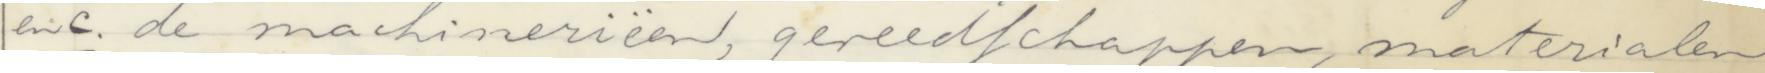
en c. de machineriëen, gereedschappen, materialen
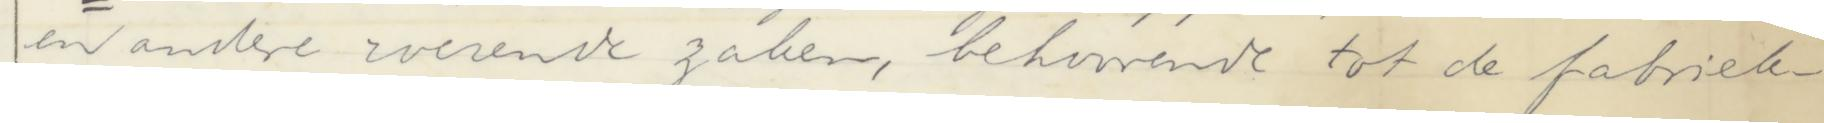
en andere roerende zaken, behoorende tot de fabriek-
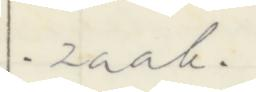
-zaak.
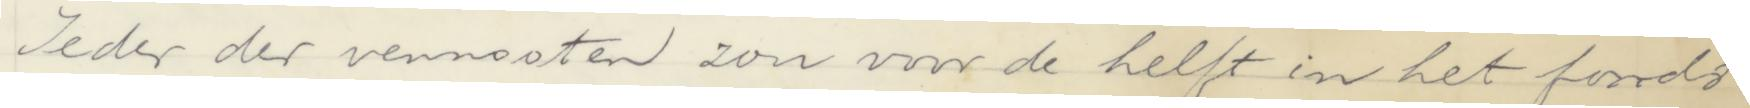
Ieder der vennooten zou voor de helft in het fonds
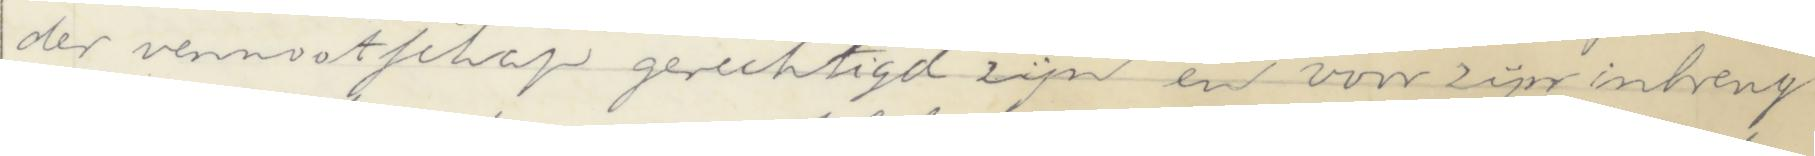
der vennootschap gerechtigd zijn en voor zijn inbreng
